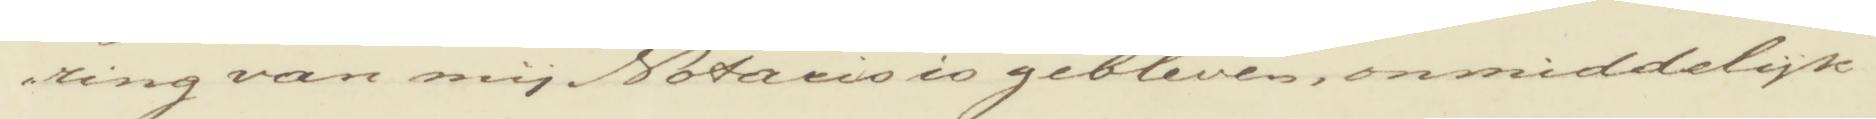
„ring van mij Notaris is gebleven, onmiddelijk
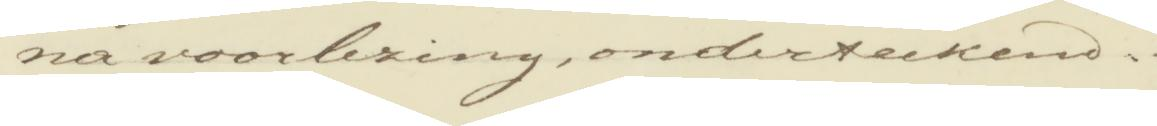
na voorlezing, onderteekend.
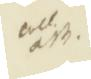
acc. dB.
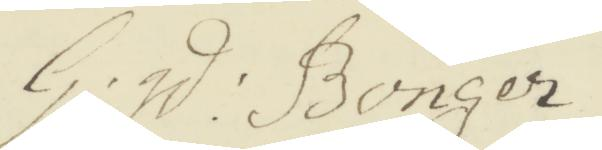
G. W: Bonger
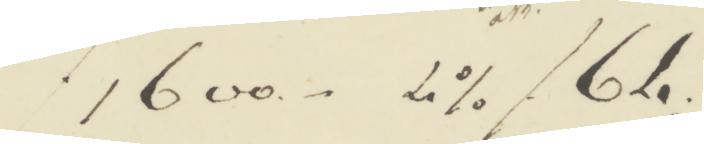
ƒ1600.- 4% ƒ 64.
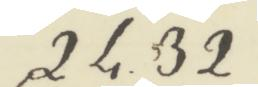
24.32
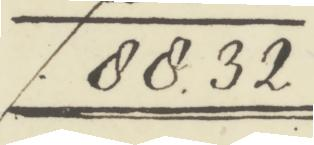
ƒ88.32
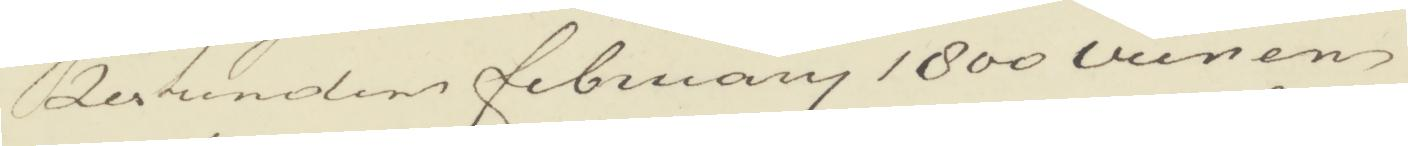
Zestienden february 1800 vier en
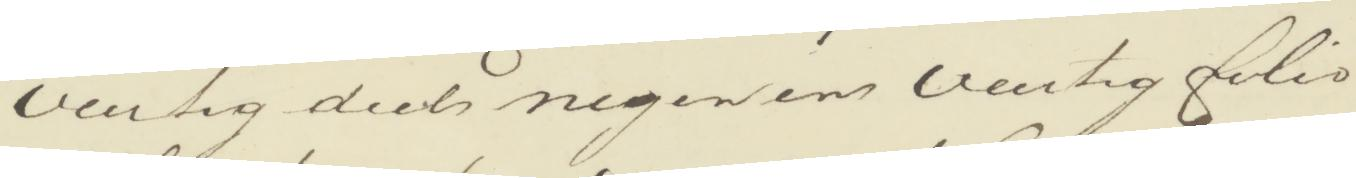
veertig deels negen en veertig folio
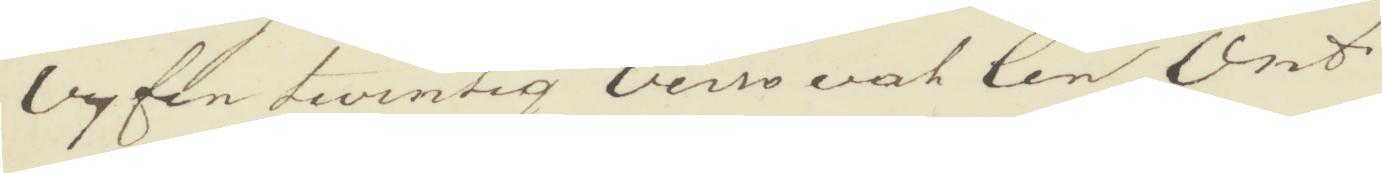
Vyfen twintig verso vak Een Ont
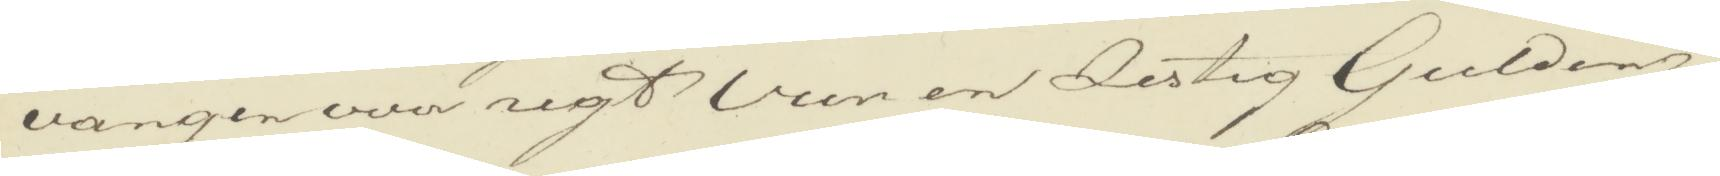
vangen voor regt van en Zestig Guldens
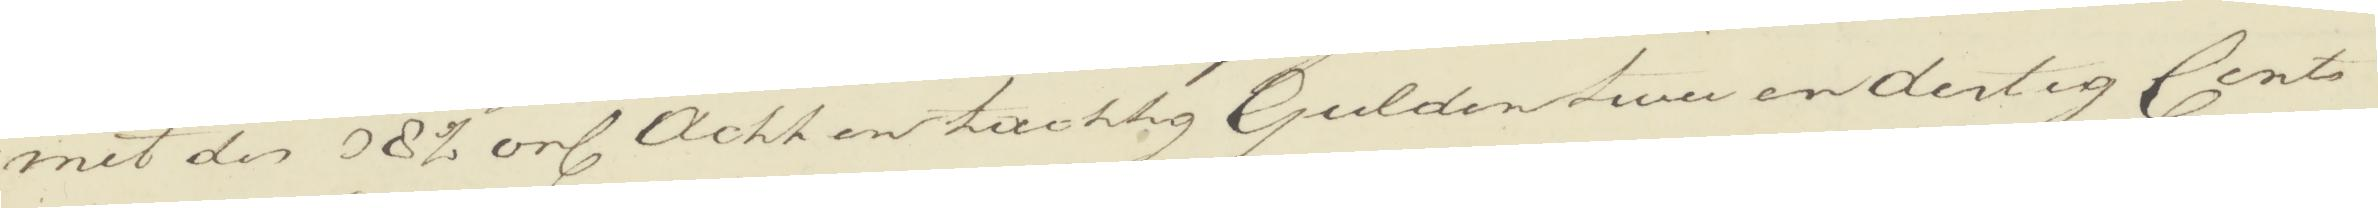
met den 38% onC Acht en tachtig Gulden twee en dertig Cents
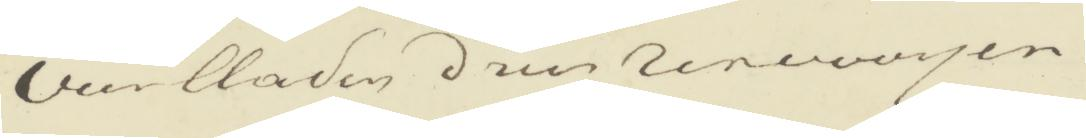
vier bladen drie renvooyen
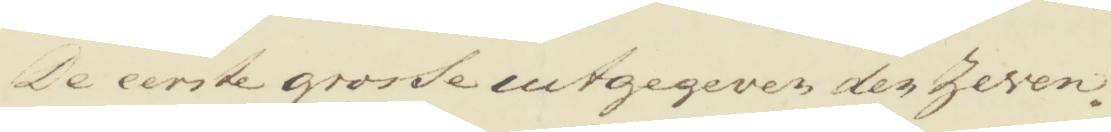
De eerste grosse uitgegeven den Zeven„
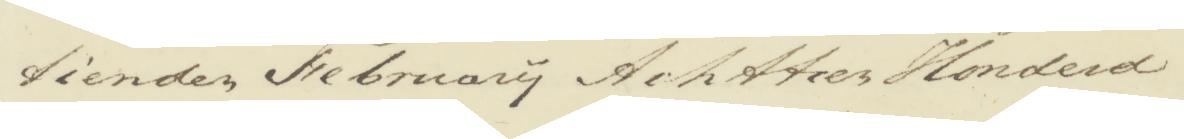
tienden Februarij Achttien Honderd
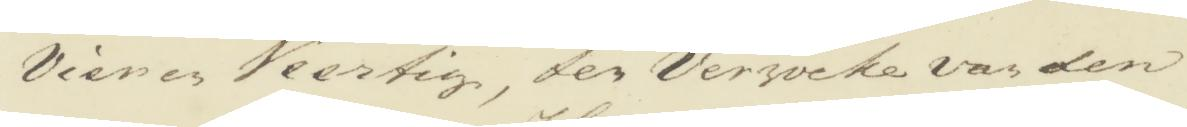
vier en Veertig, ten verzoeke van den
